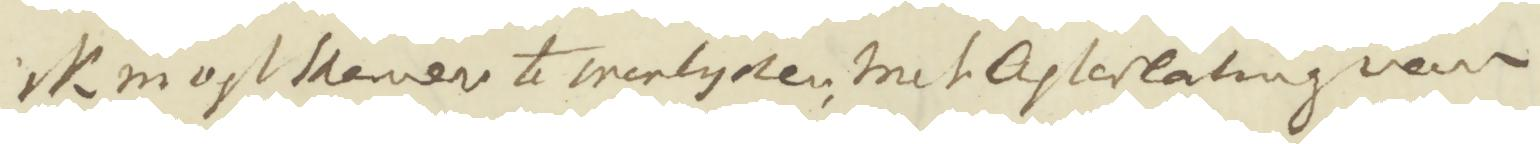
ik mogt komen te overlyden, met Agterlating van
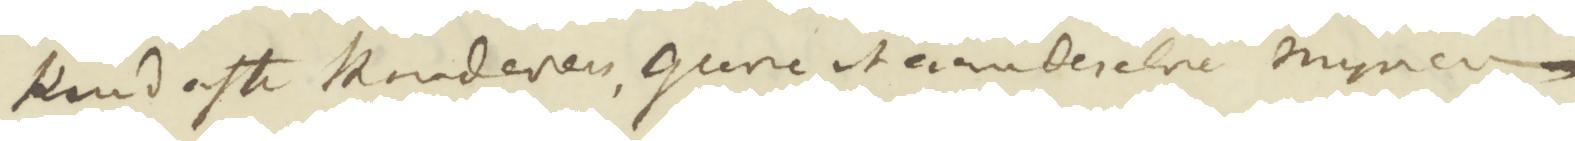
kind ofte Kinderen, geeve t aan deselve mynen
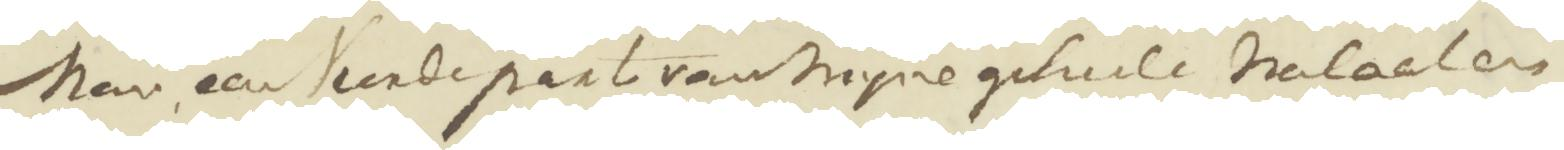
Man, een Vierde part van myne geheele Nalaeten
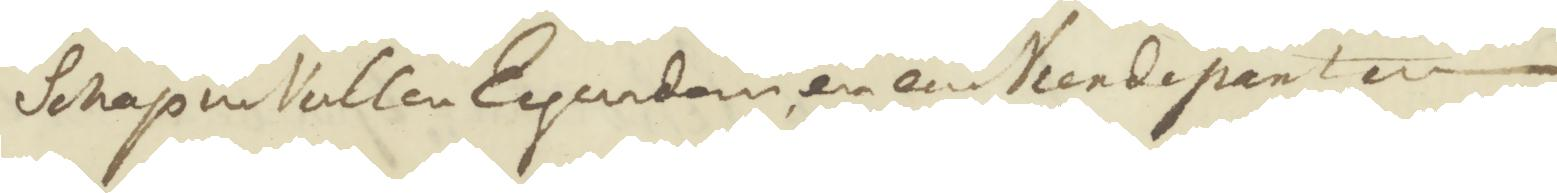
schap in Vollen Eigendom, en een Vierde parten
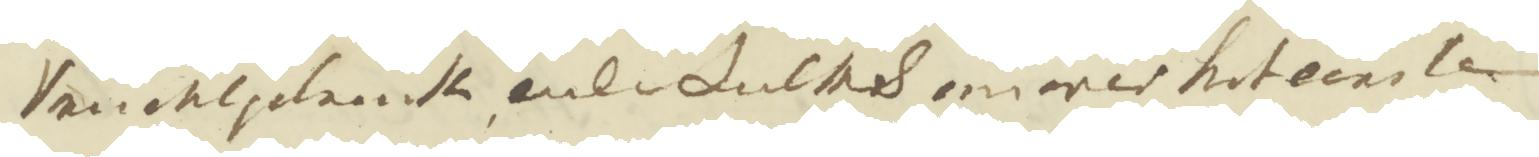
Vruchtgebruik, ende zulks om over het eerste
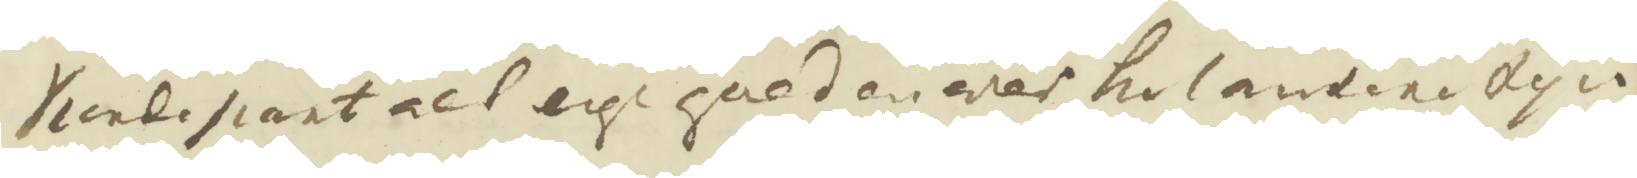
Vierde part als eige goed, en over het andere zyn
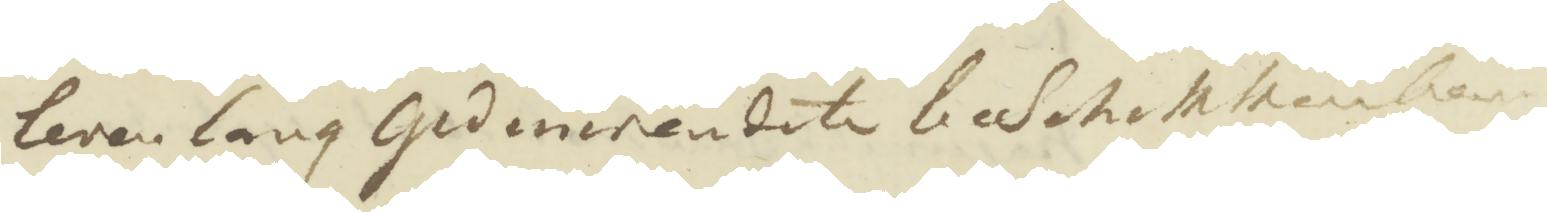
leven lang gedenerende te beschikken, hem
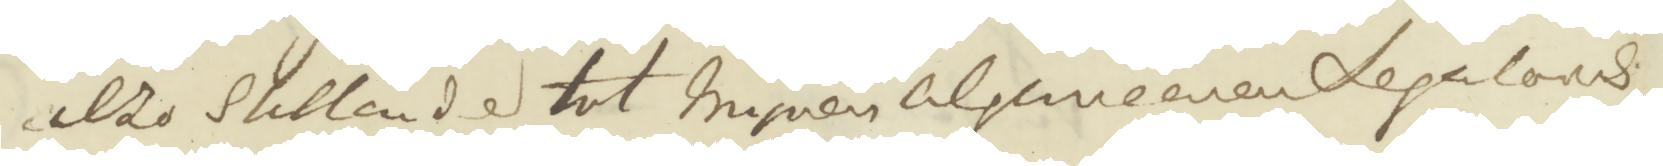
alzo stellende tot mynen algemeenen Legataris
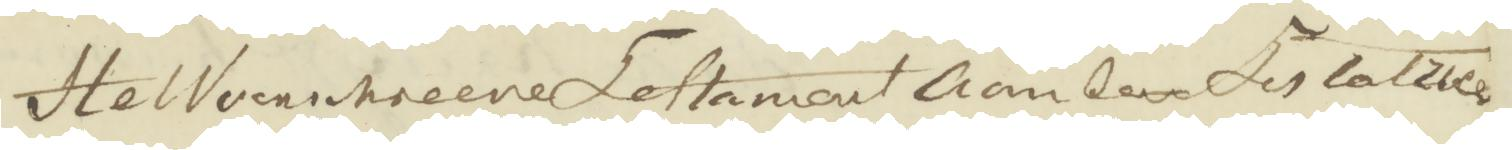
Het Voorschreeve Testament Aan den Testatrice
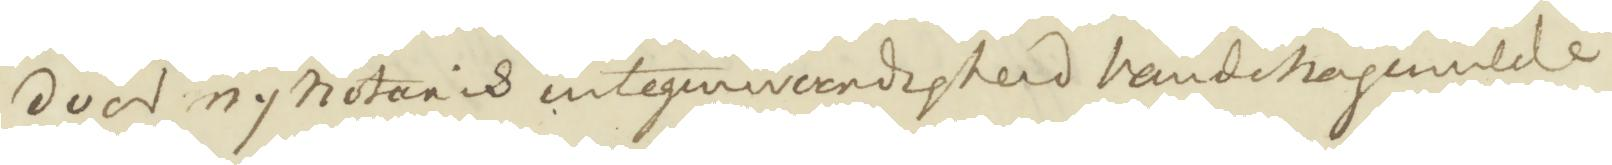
door my notaris integenwoordigheid vande nagemelde
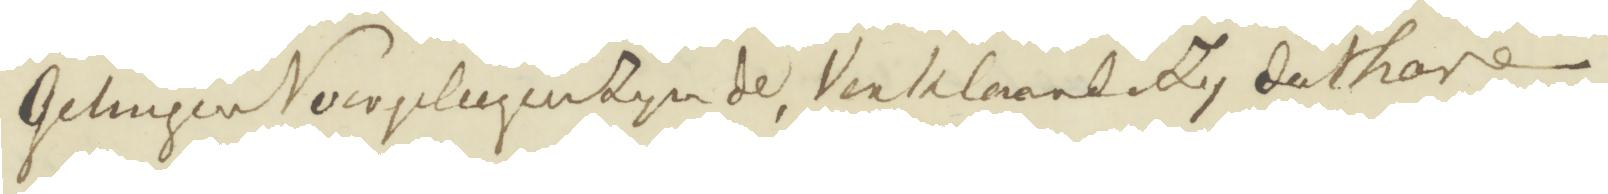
Getuigen Voorgeleezen Zynde, Verklaarde Zy dat hare
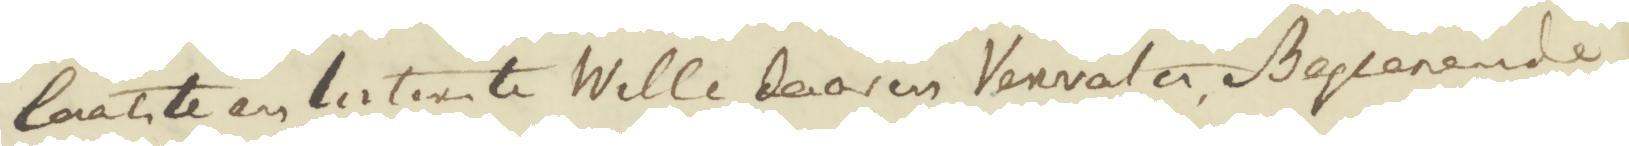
laatste en Uiterste Wille daarin Vervat is, Begeerende
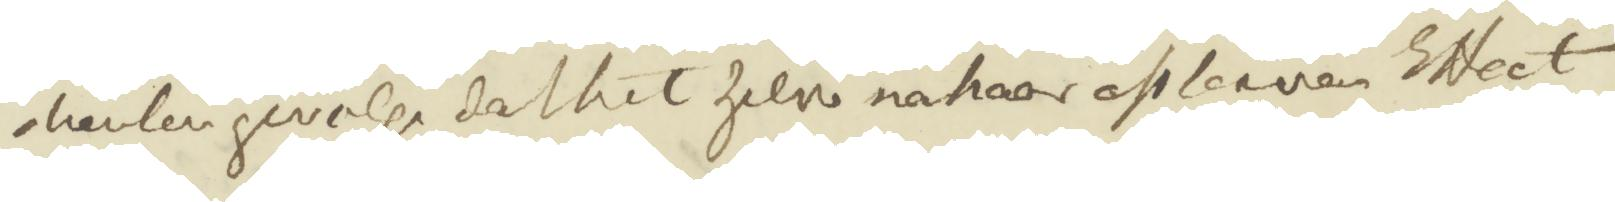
dien ten gevolge dat het zelve na haar afsterven Effect
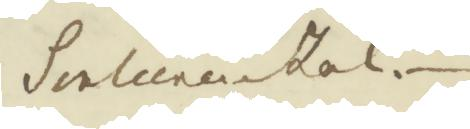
Sorteeren Zal.—
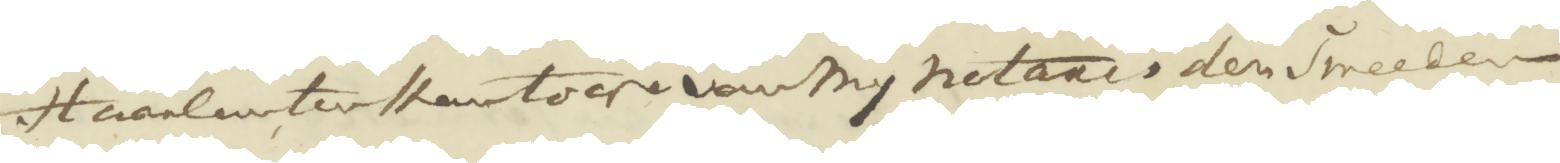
Haarlem ten kantoore van my notaris den Tweeden
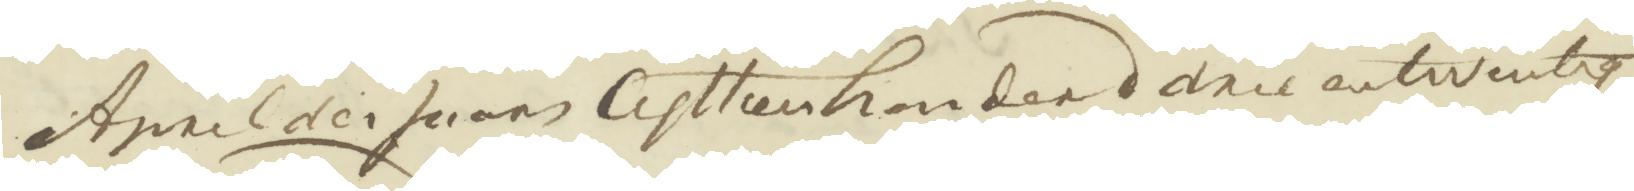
April des Jaars Agttienhonderd drie en twintig
